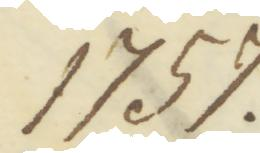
1757.
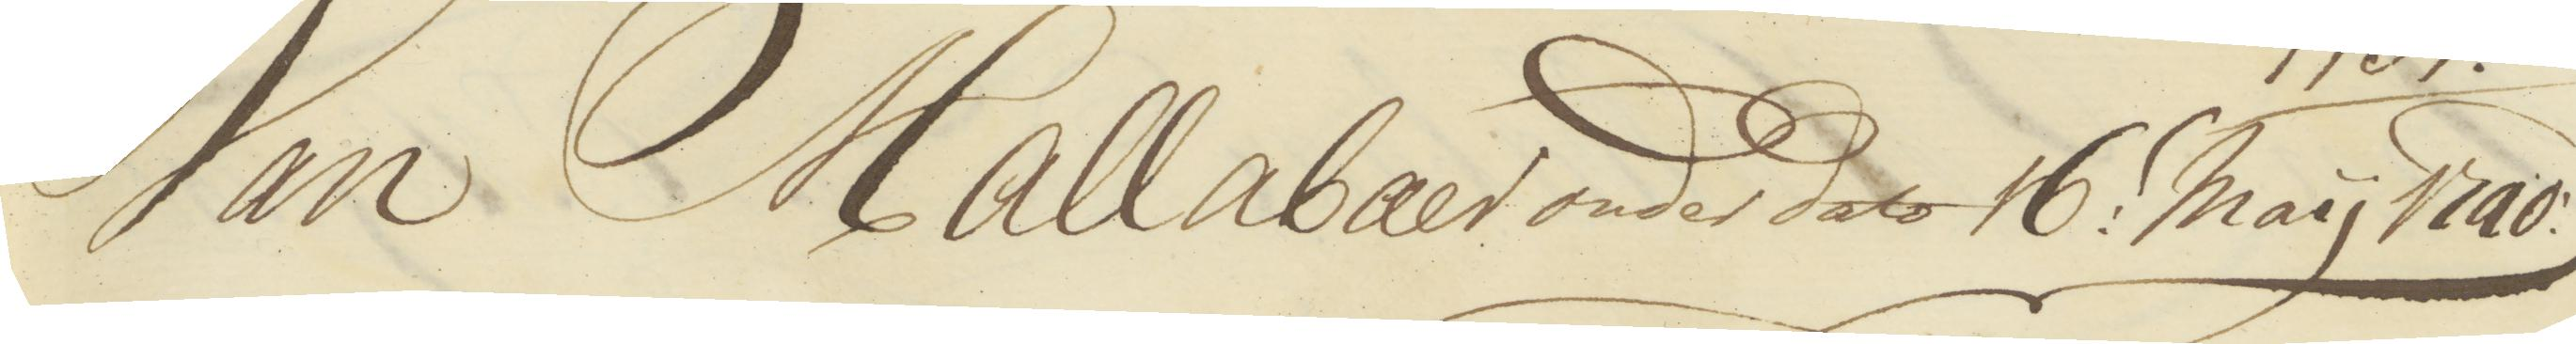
Van Mallabaer onder dato 16:' Maij 1740:
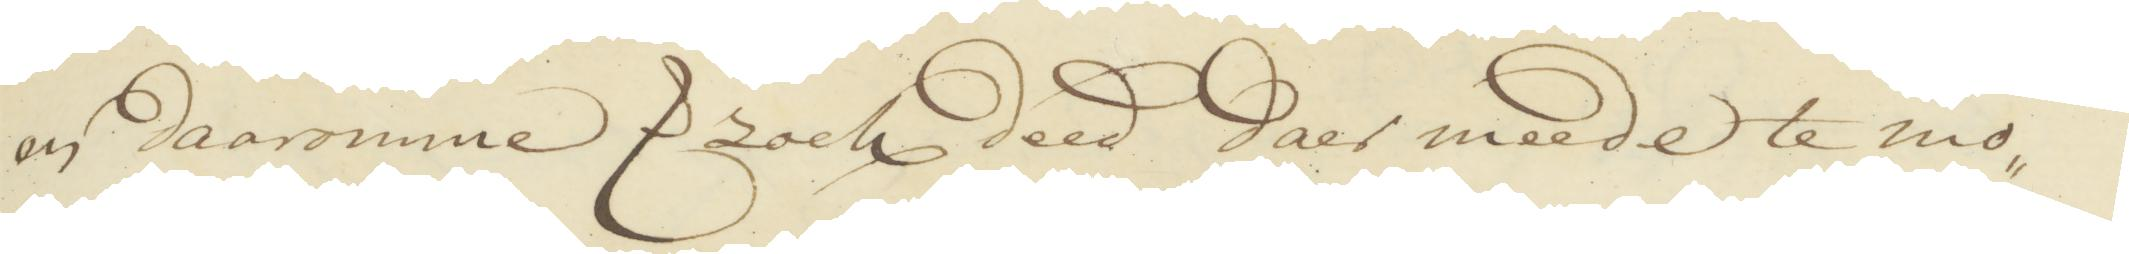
en daaromme verzoek deed daer meede te mo„
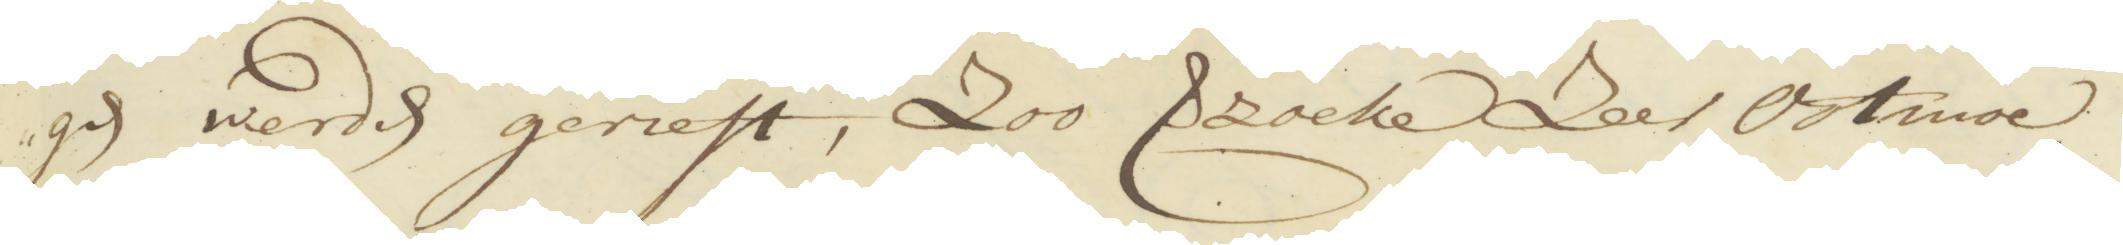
„gen werden gerieft, zoo verzoeke zeer Ootmoe
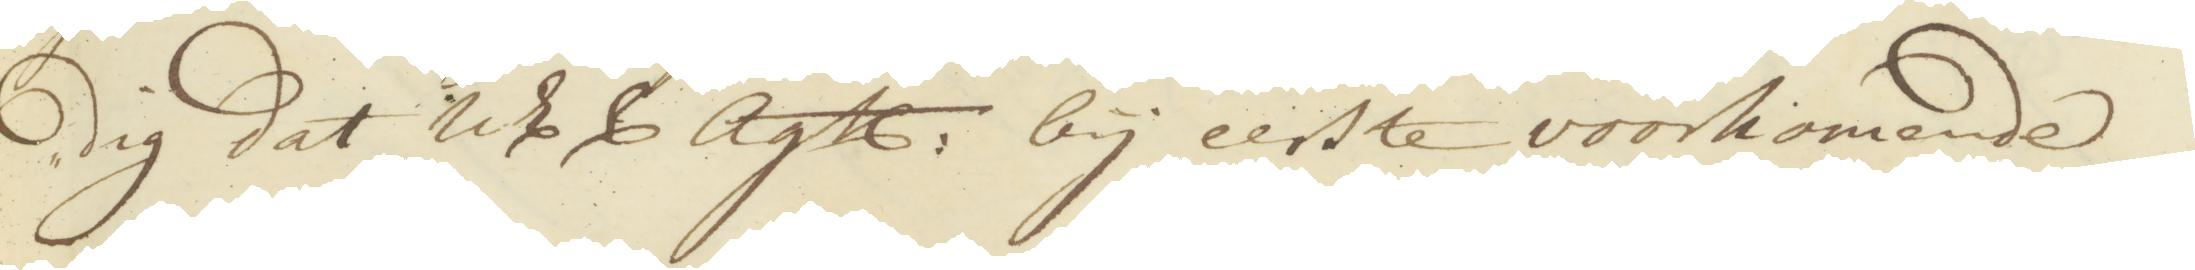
„dig dat UE E Agtb: bij eerste voorkomende
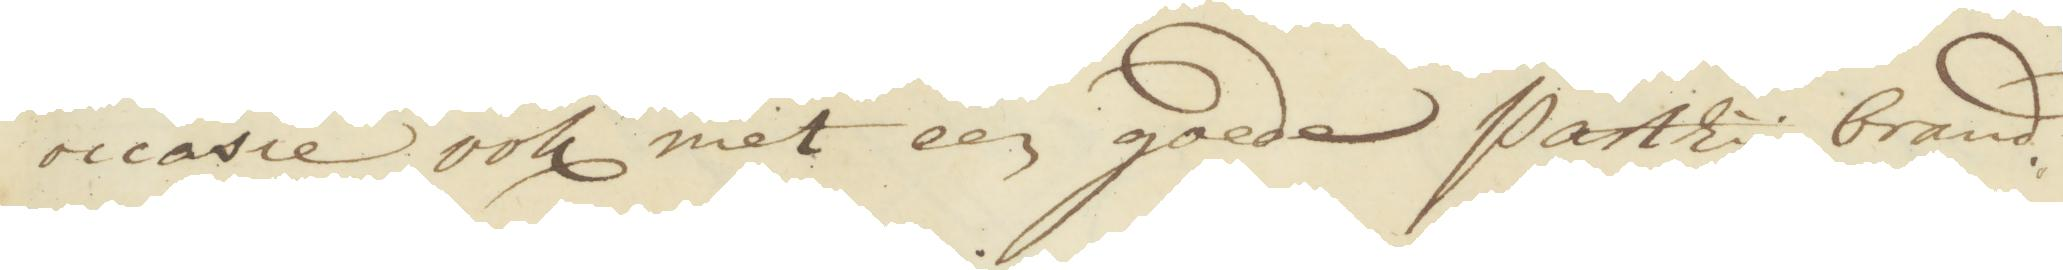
occasie ook met een goede parthij brand„
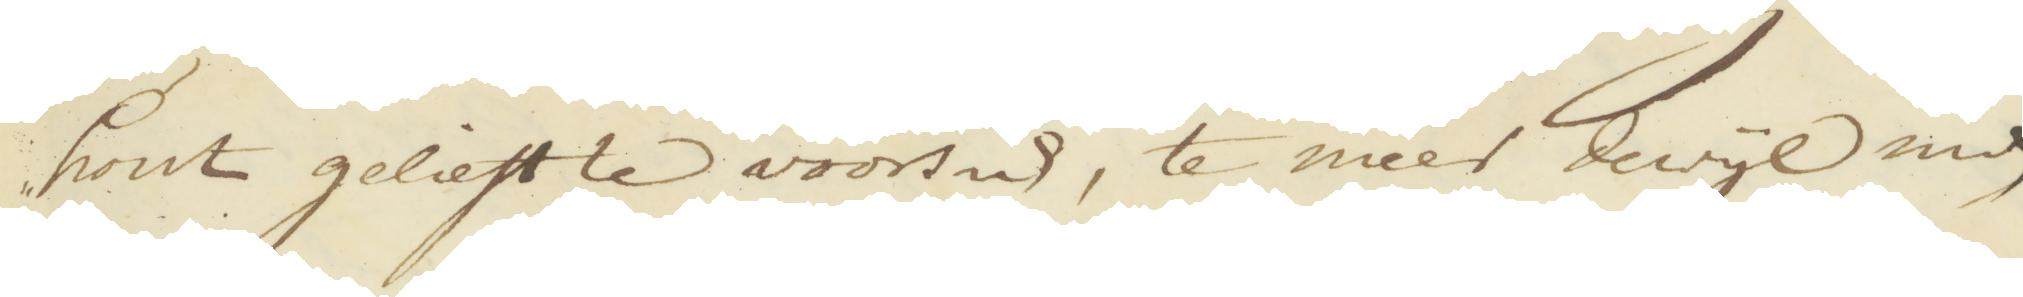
„hout gelieft te voorsien, te meer dewijl men
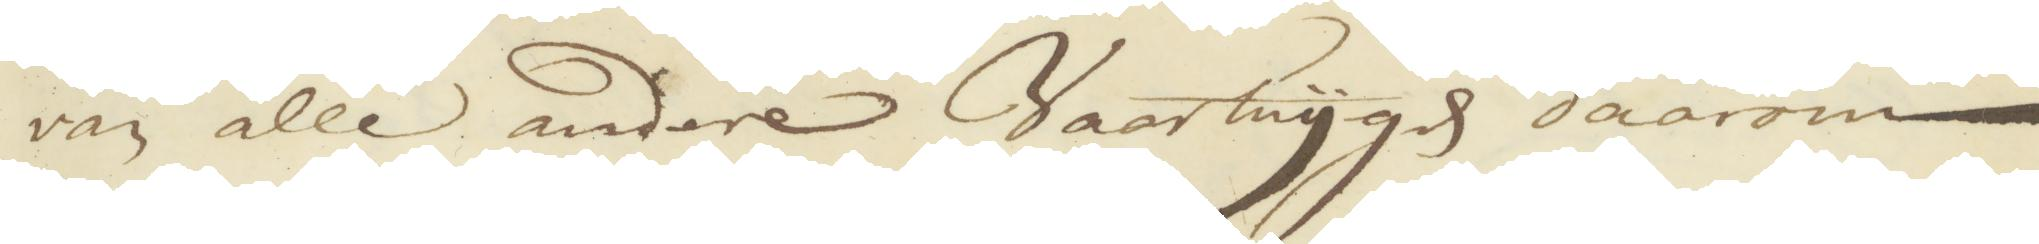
van alle andere Vaartuijgen daarom
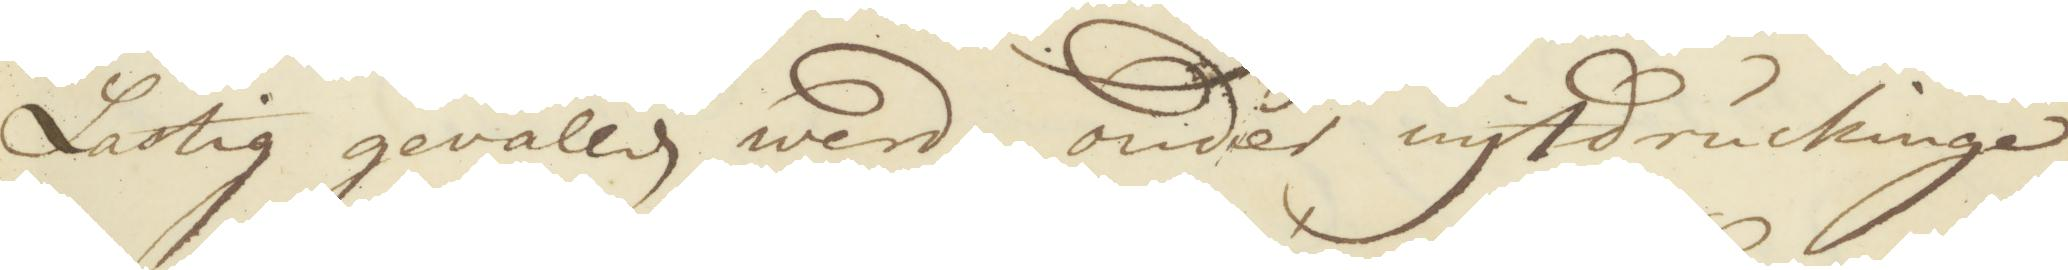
Lastig gevallen werd, onder uijtdruckinge
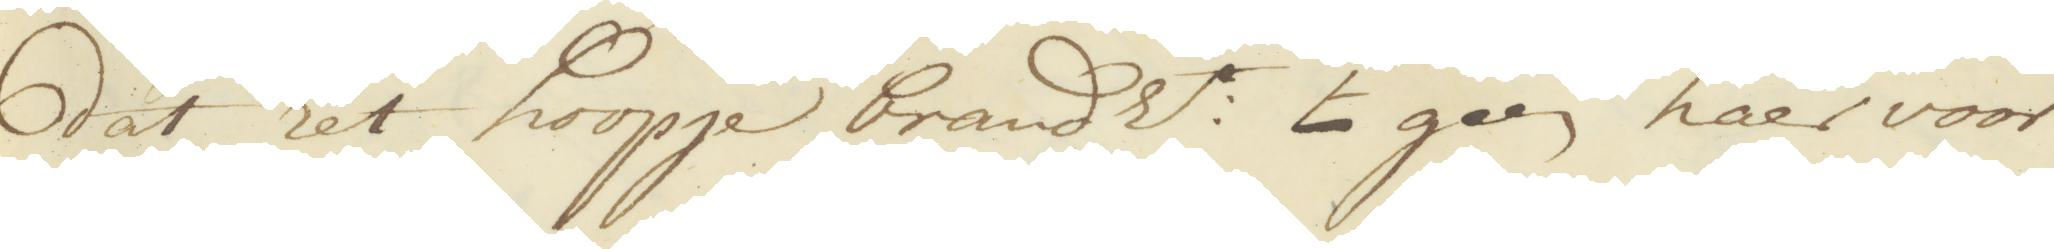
dat het hoopje brandh:t ’t geen haer voor
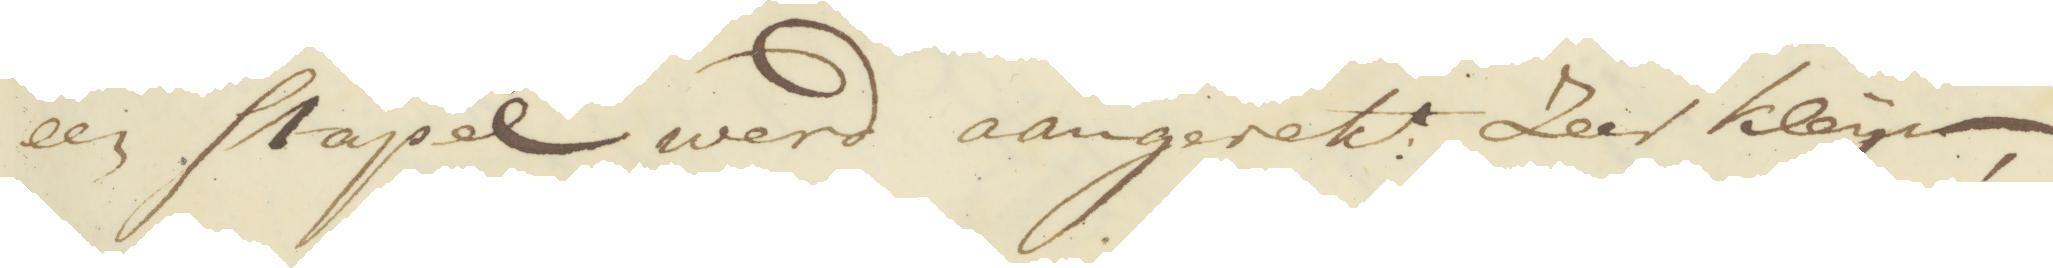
een stapel werd aangerek:t zeer kleijn,
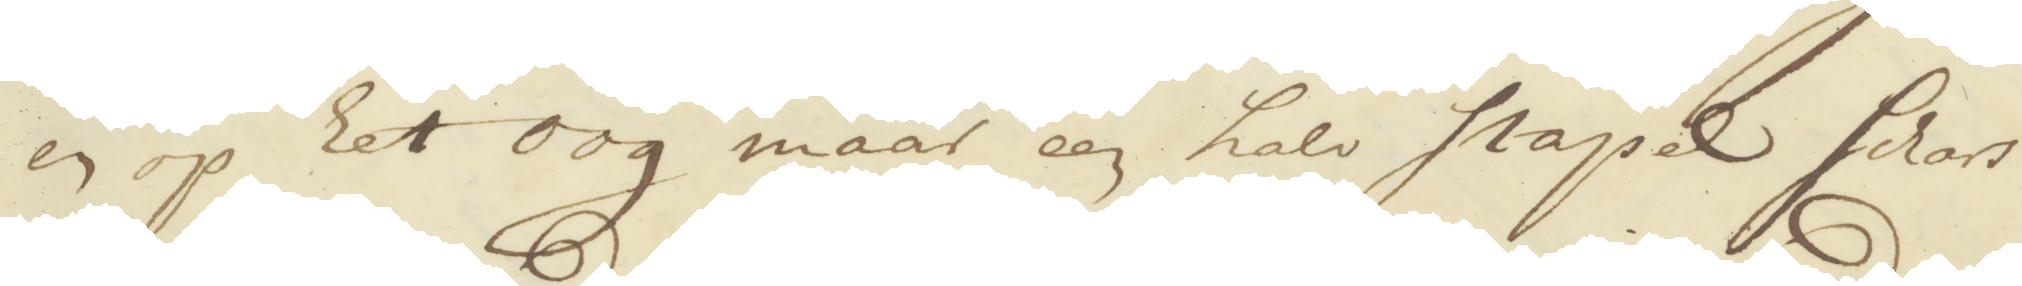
en op het oog maar een halve stapel schors
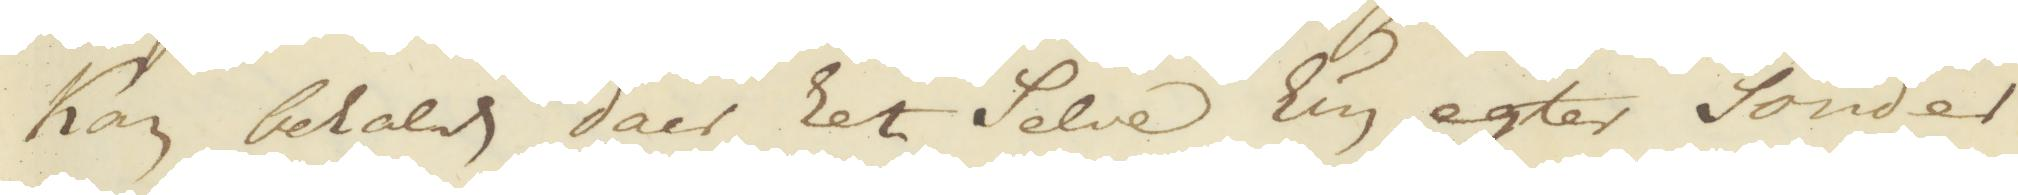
kan behalen daer het selve hun egter sonder
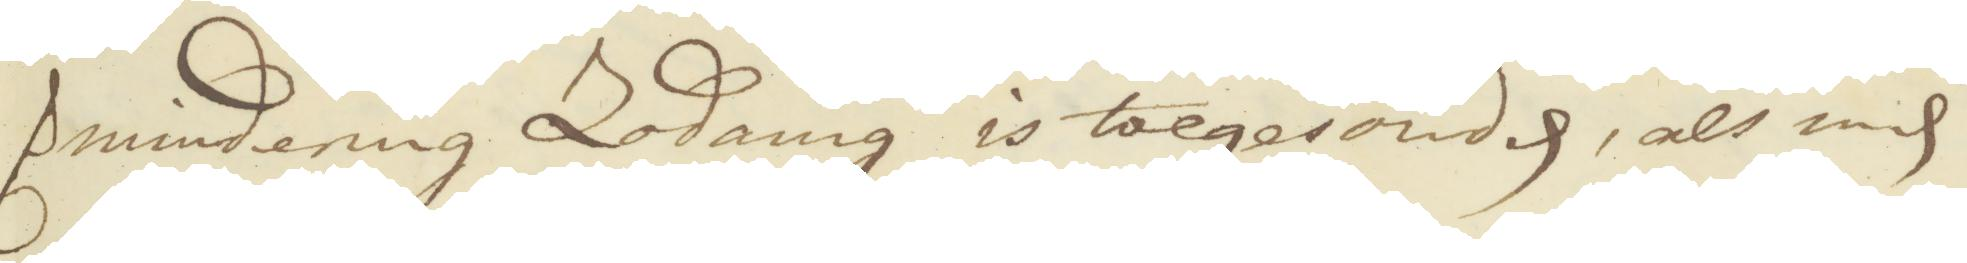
vermindering zodanig is toegesonden, als men
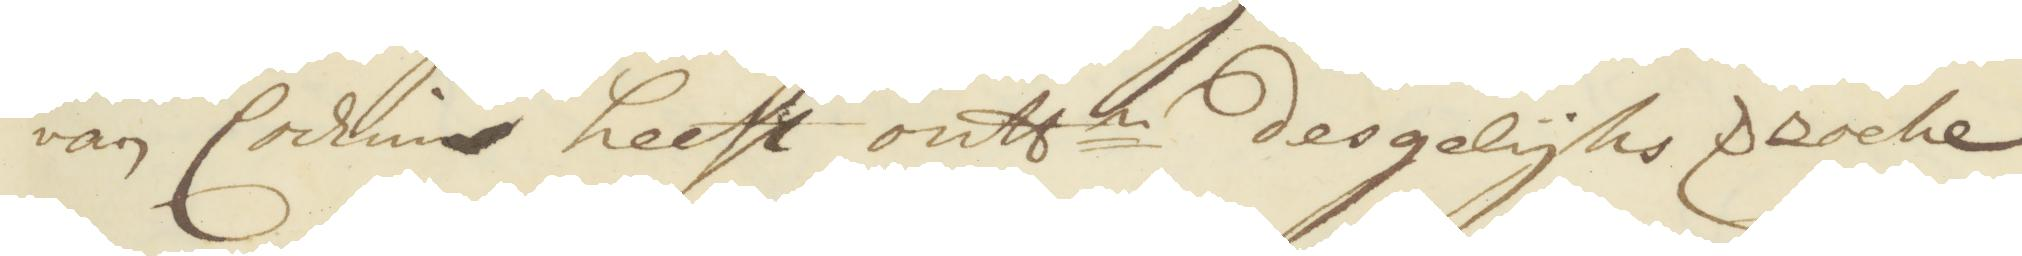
van Cochim heeft ontf=n desgelijks verzoeke
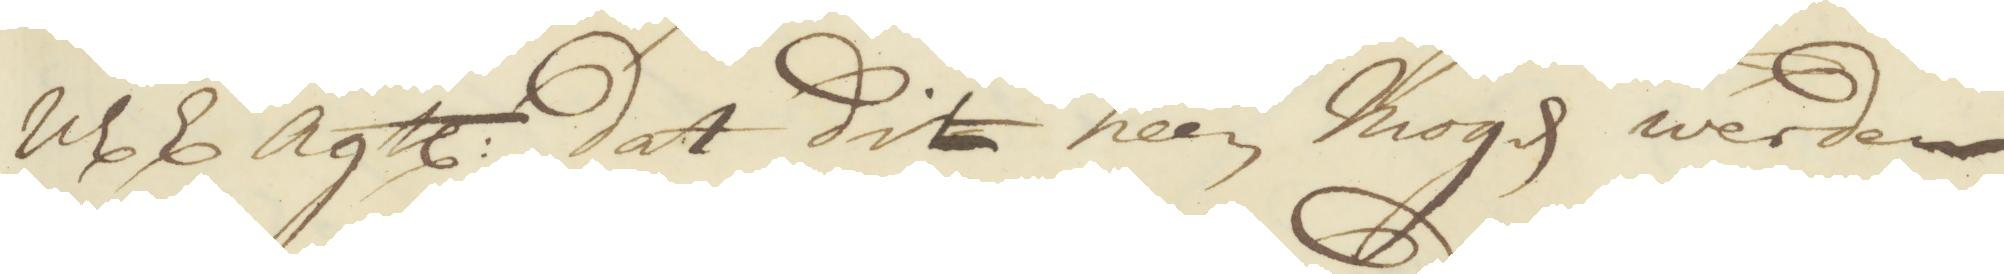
UEE agtb: dat dit heen mogen werden
